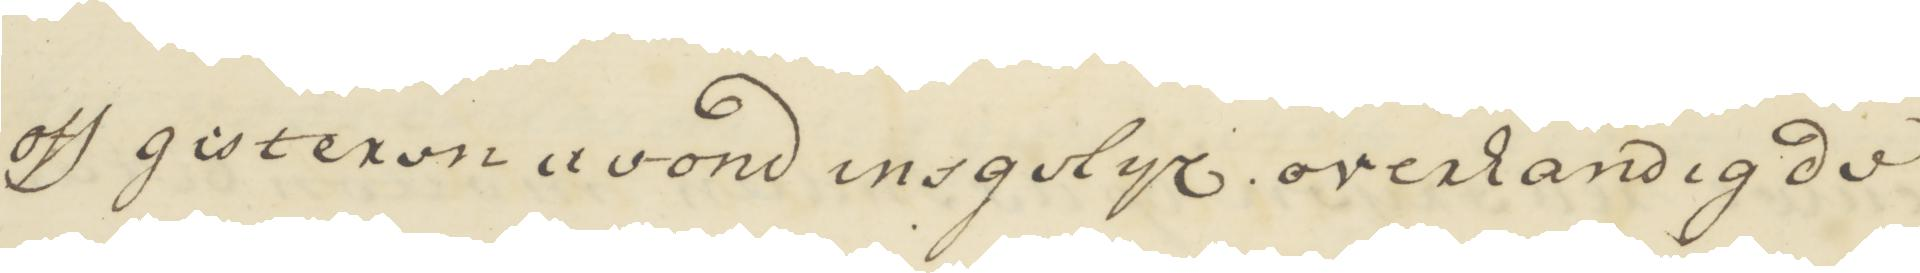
off gisteren avond insgelyx overhandigde
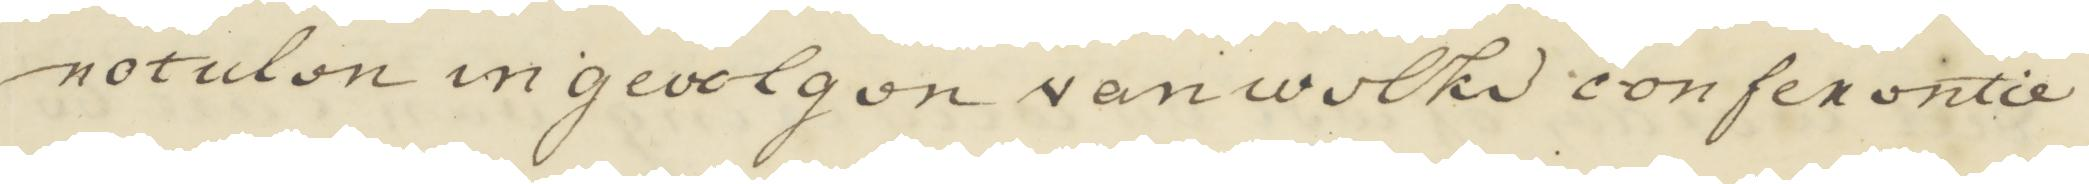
notulen in gevolgen van welke conferentie
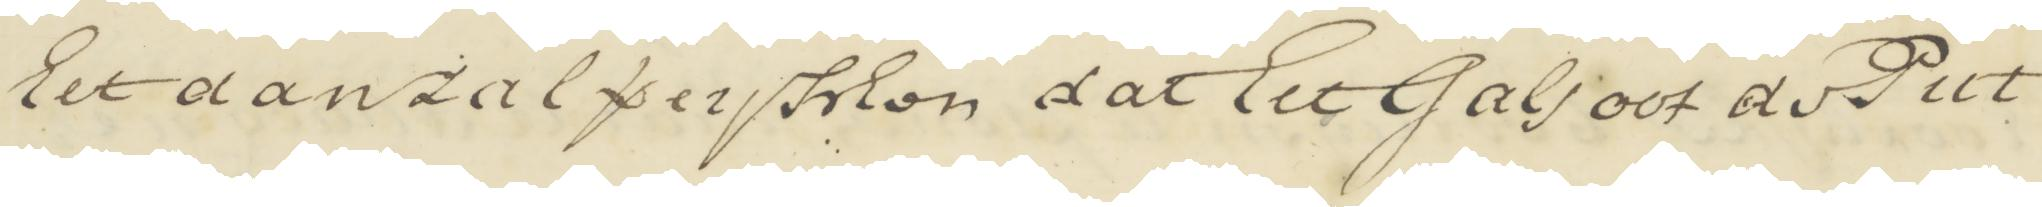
het dan zal vereyschen dat het Galjoot de Put
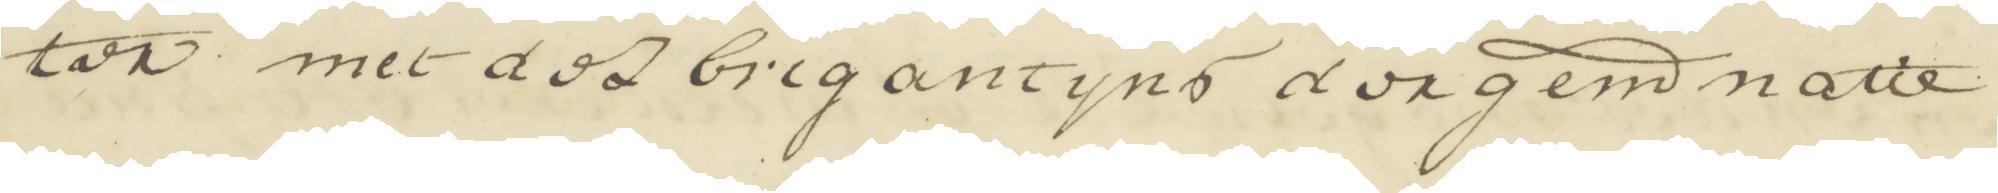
ter met der brigantyns der gem notie
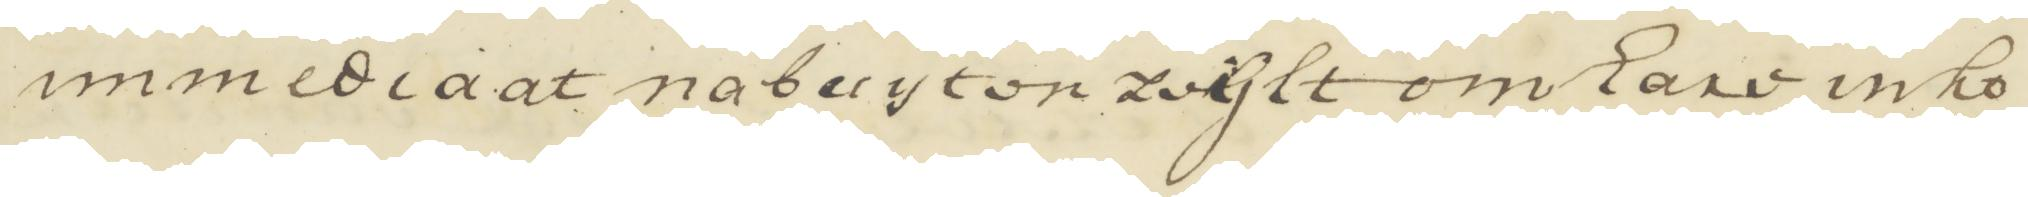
immediaat na buyten zeijlt om hare inko
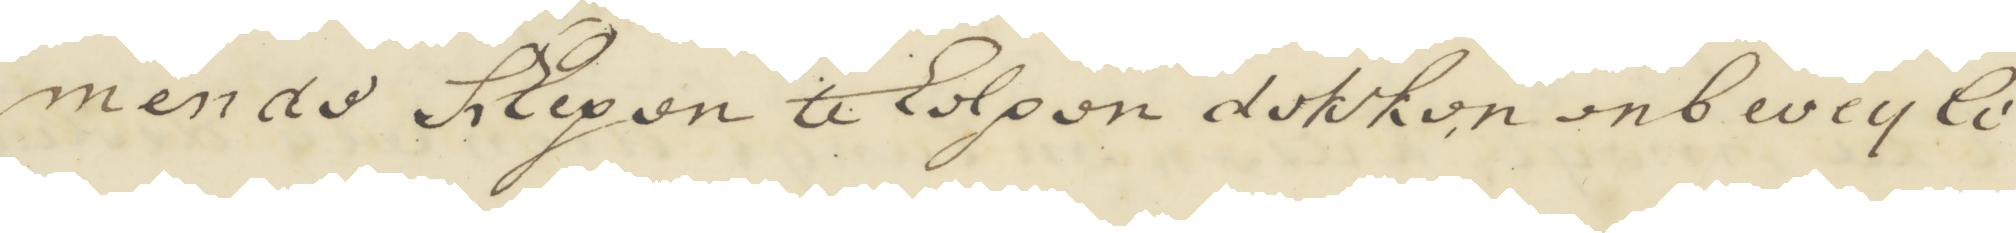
mende schepen te helpen dekken en beveyle
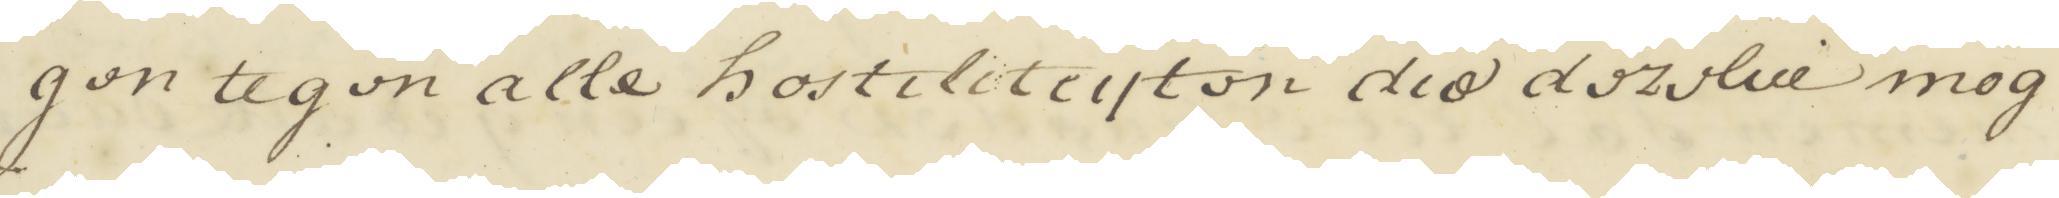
gen tegen alle hostiliteyten die dezelve mog
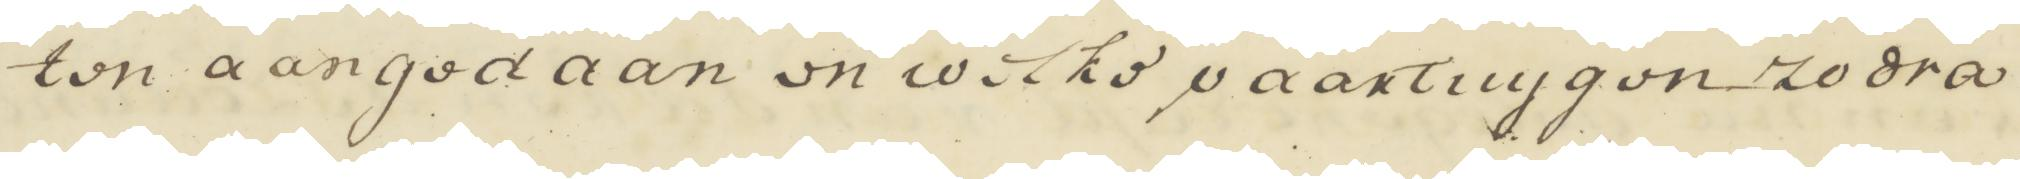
ten aangedaan en welke vaartuygen zodra
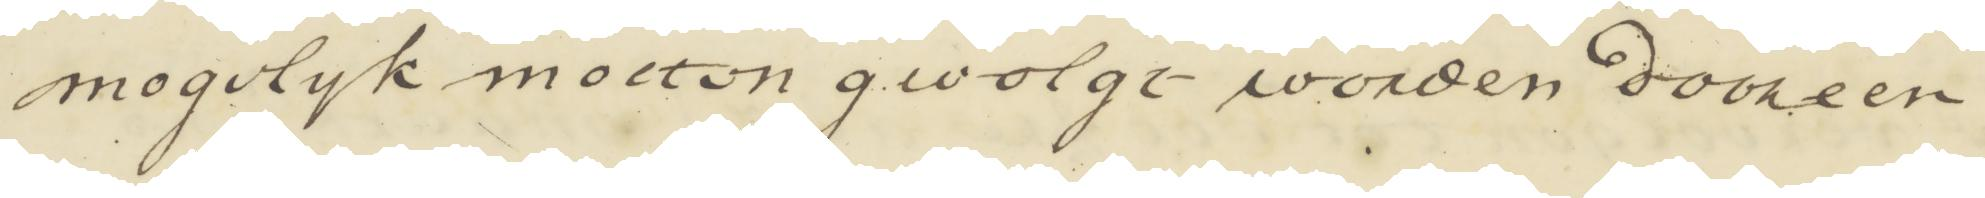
mogelyk moeten gevolgt worden door een
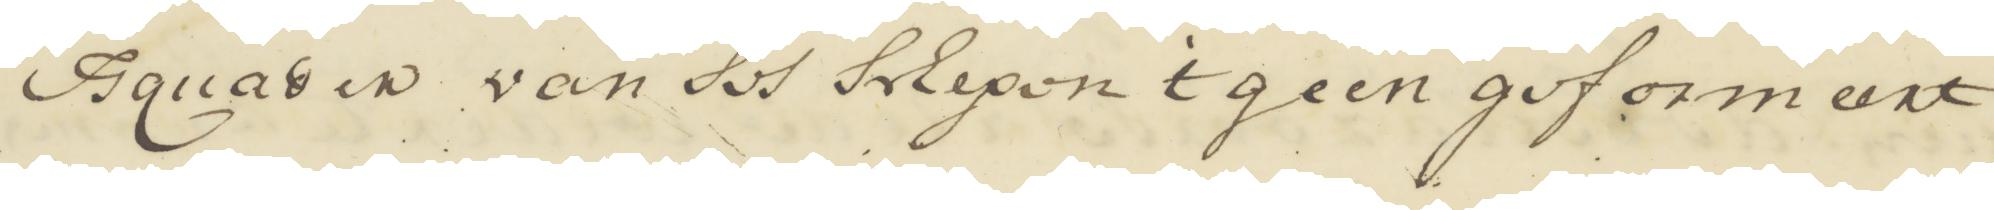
Esquader van ses schepen ’t geen geformeert
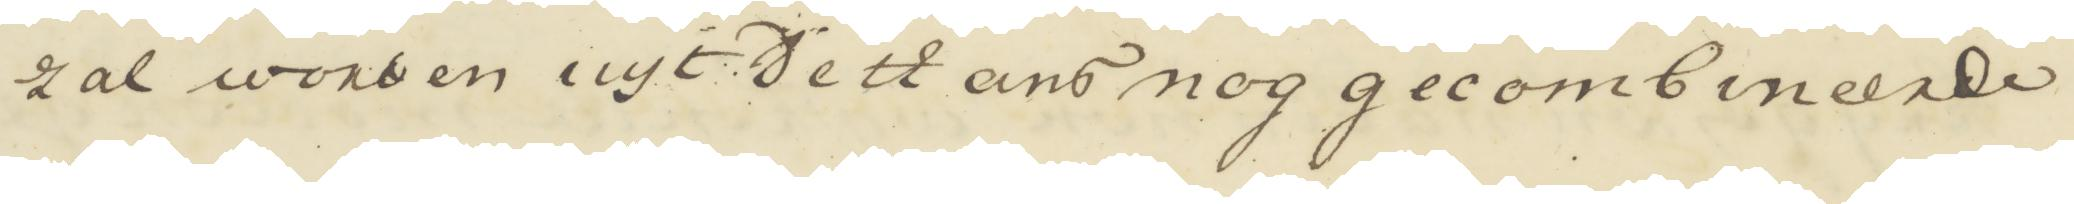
zal worden uyt de thans nog gecombineerde
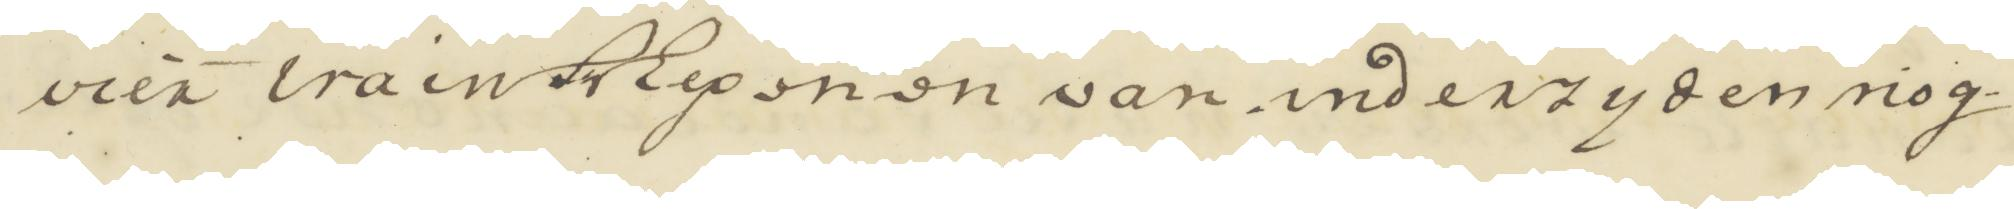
vier trainschepenen van in der zyden nog
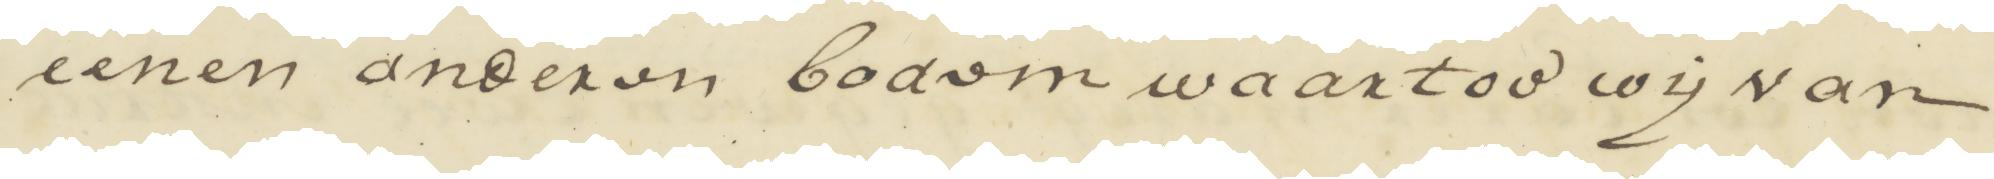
eenen anderen bodem waartoe wij van
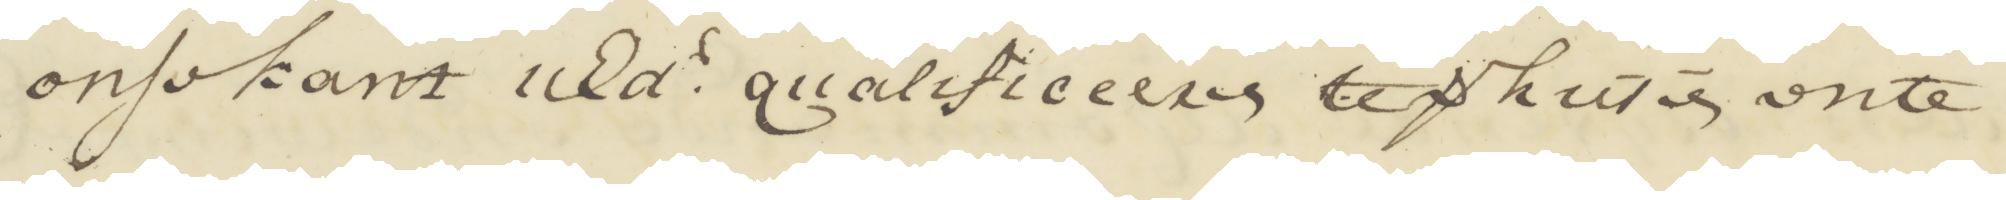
onse kant uEd:s qualificeeren te verhusen en te
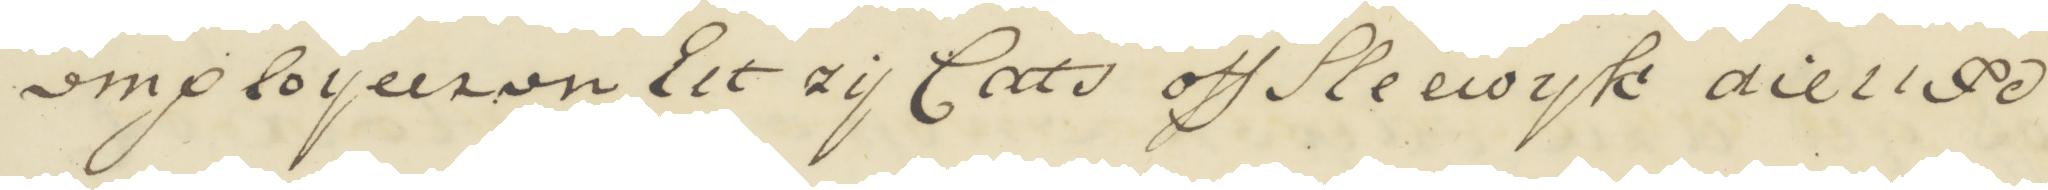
employeeren het zij Cats off sleewyk die uEd
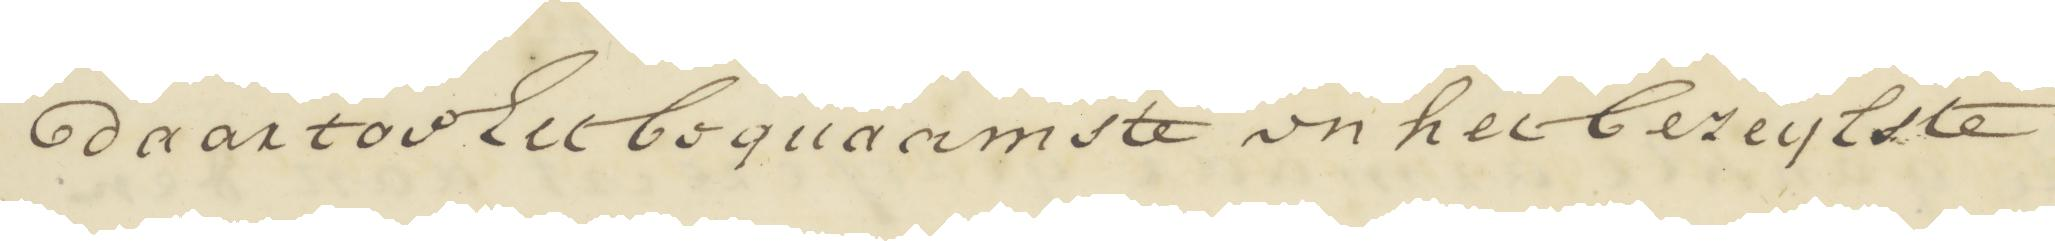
daar toe het bequaamste en het bezeylste
